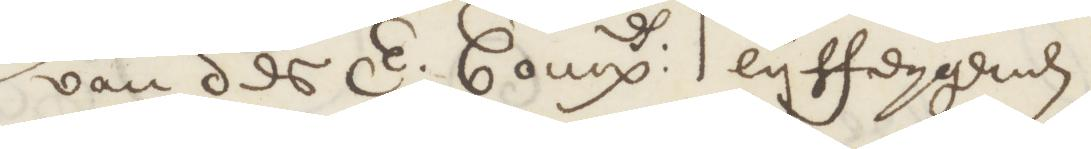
van des E: Comp:s lijffeygenen
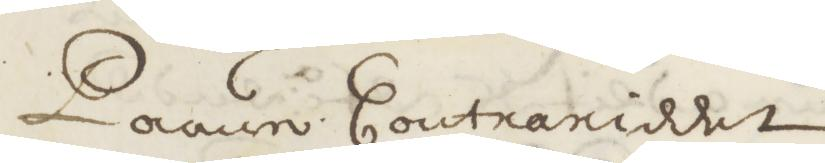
Paauw: Contrarieert
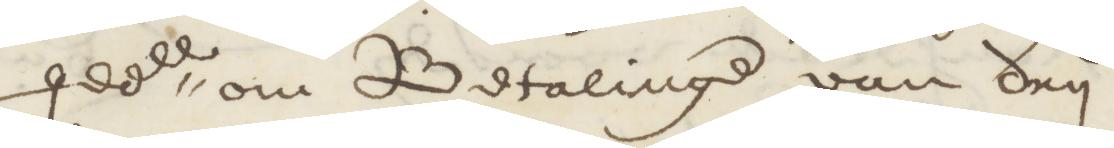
ged„e om Betalinge van drij
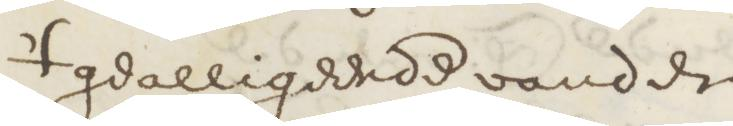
’t gealligeerde vander
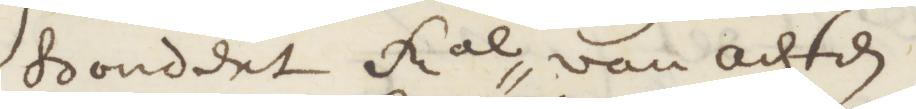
hondert R„al van achten
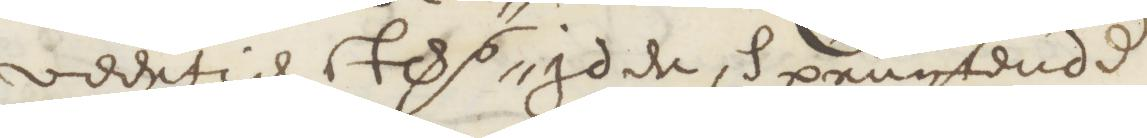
veertich stver„s jder, spruytende
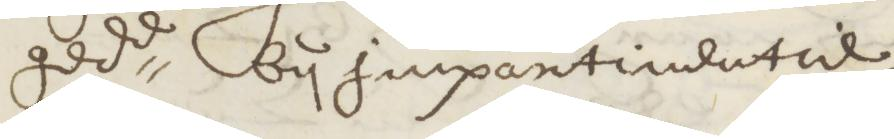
ged„e bij jmpartinentie
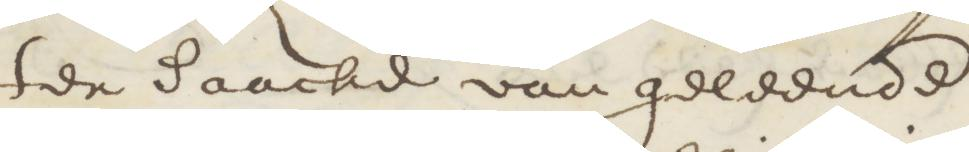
ter saacke van geleende
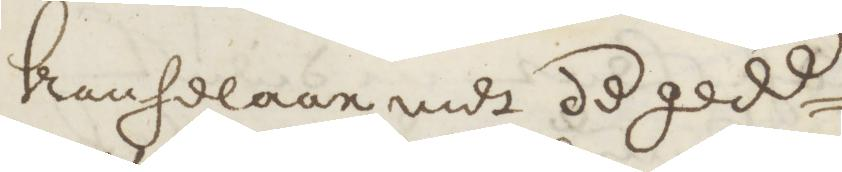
kanselaar met de ged=e
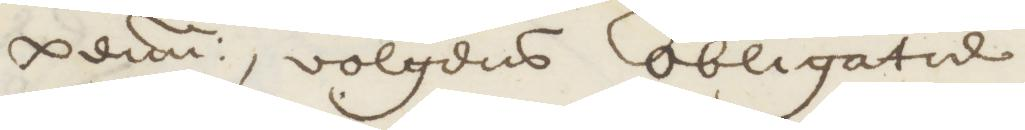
penn:, volgens obligatie
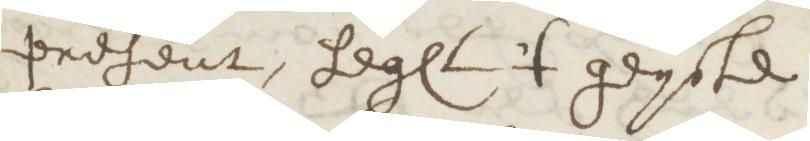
present, seght ’t geyste
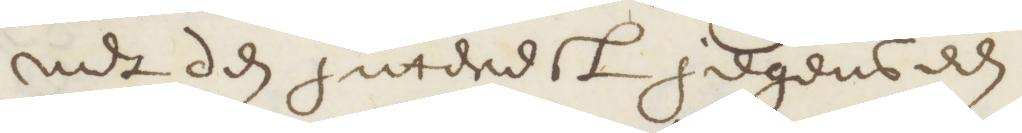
met den jnterest jegens een
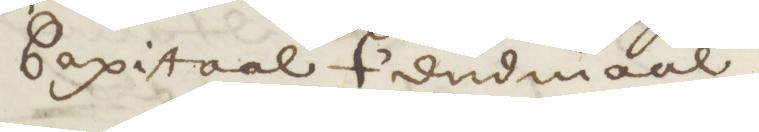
Capitaal tenemaal
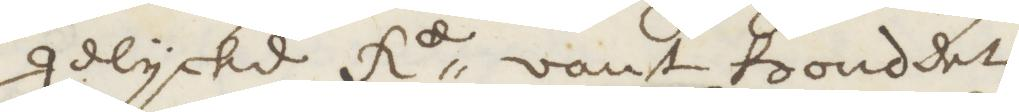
gelijcke R„a van t hondert
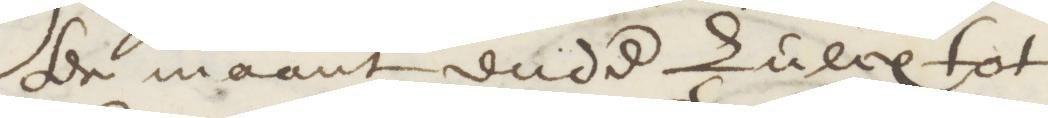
ter maant ende zulcx tot
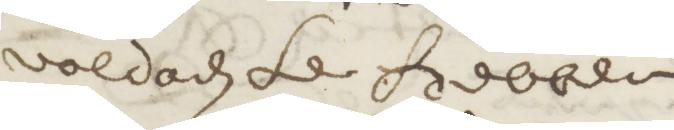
voldaen te hebben
